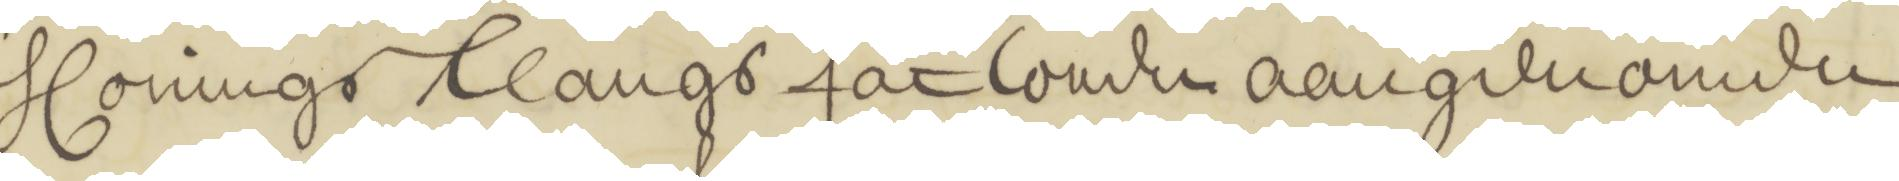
'sConings klangs factoren aangenomen
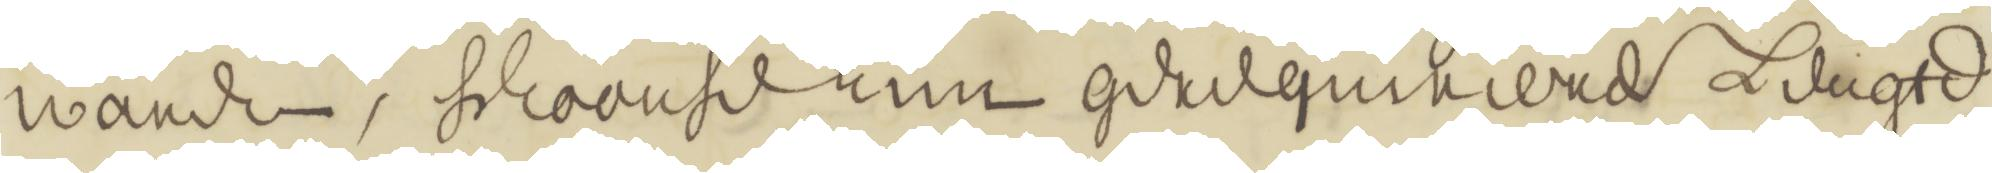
waren, schoonse hun gerequireerde Leecgtte
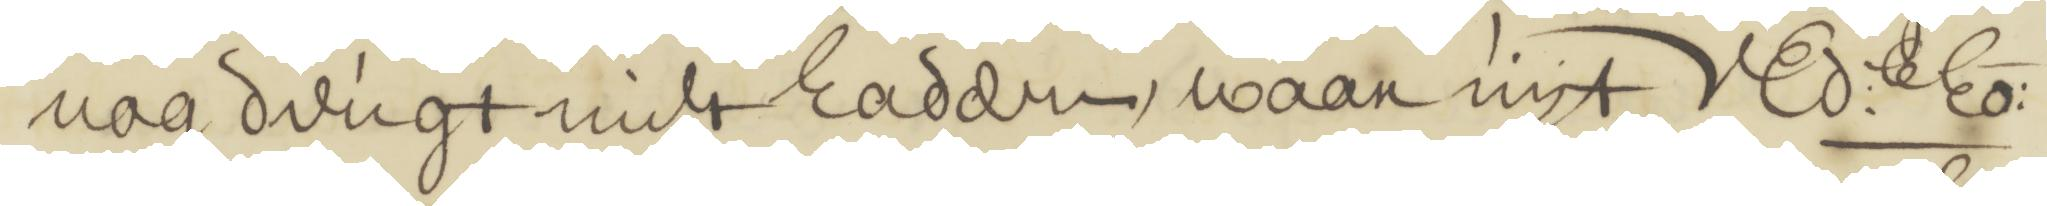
nog deugt niet hadden, waar uijt VEd:le ho:
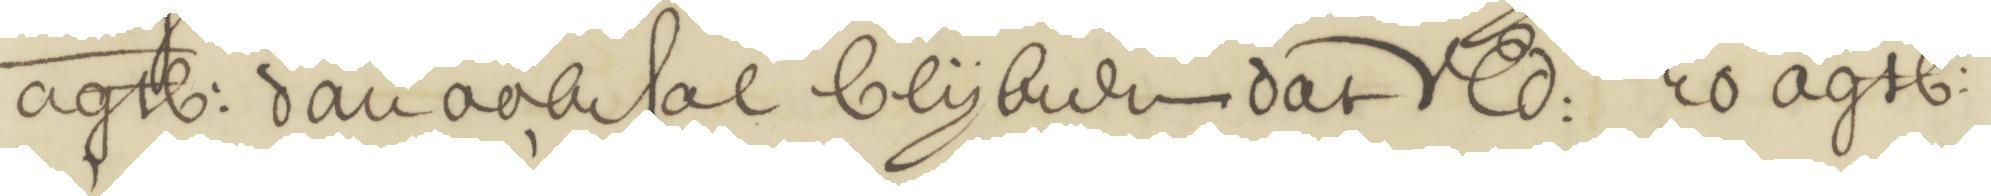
agtb: dan ooksal blijken dat VEd:le ho agtb:
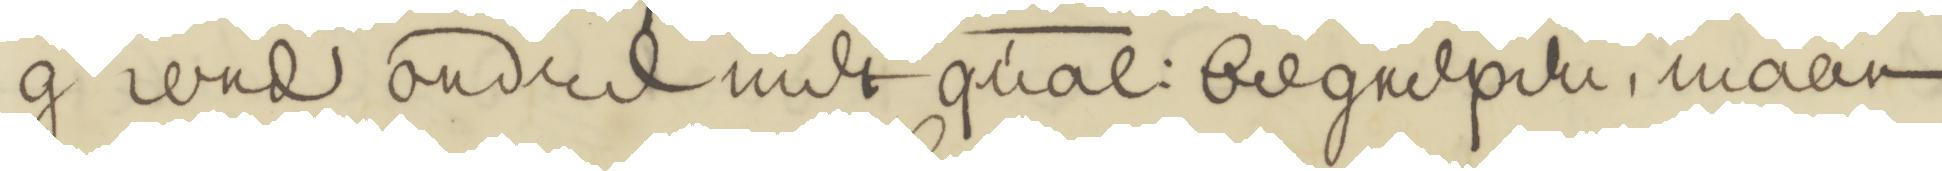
g’eerde ord're niet qual: begrepen, maar
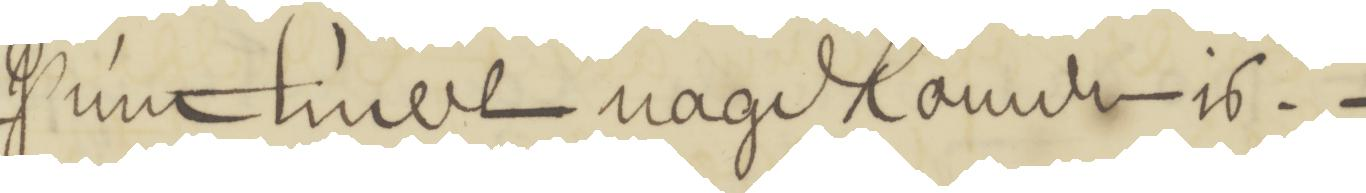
Punctueel nagekomen is. —
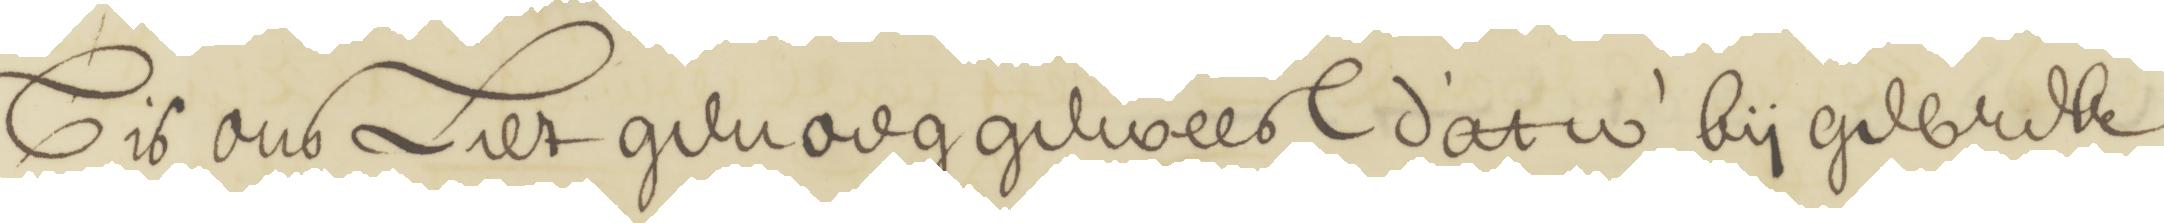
'T is ons Let genoeg geweest dat w' bij gebrek
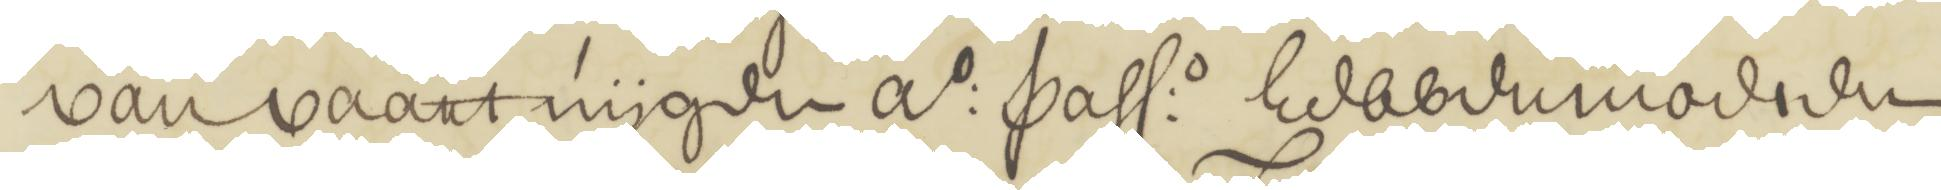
van vaartuijgen a:o pass:o hebbenmoeten
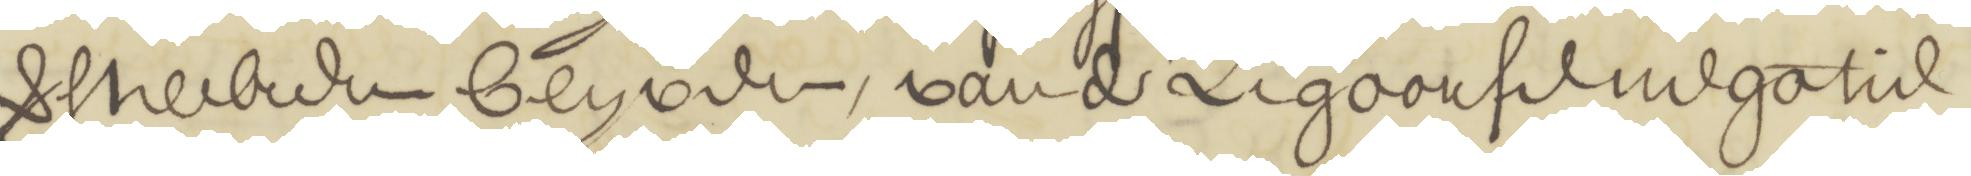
versteeken blyven, van de Ligoorse negotie
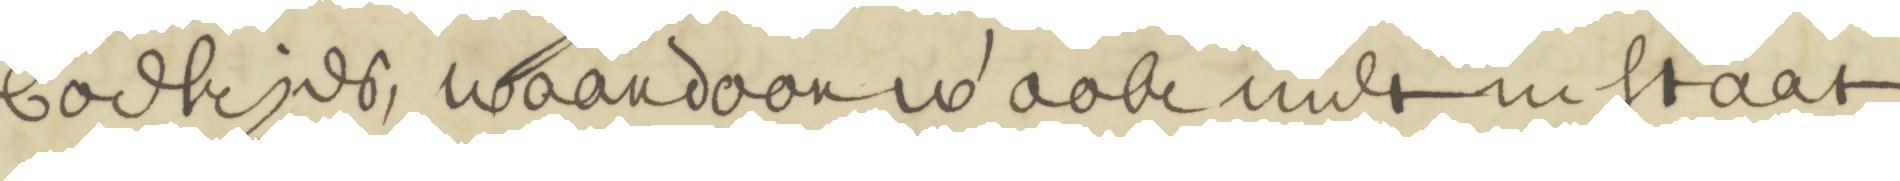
boekjes, waardoor w' ook niet in staat
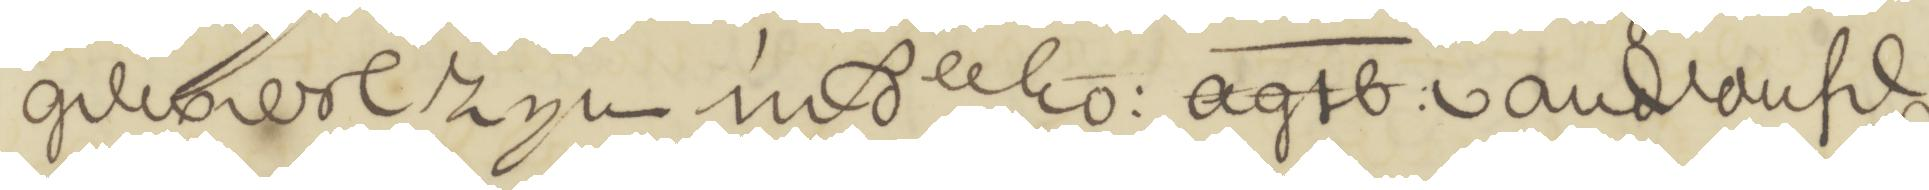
geweest zyn uEdle ho: agtb: vandeonse
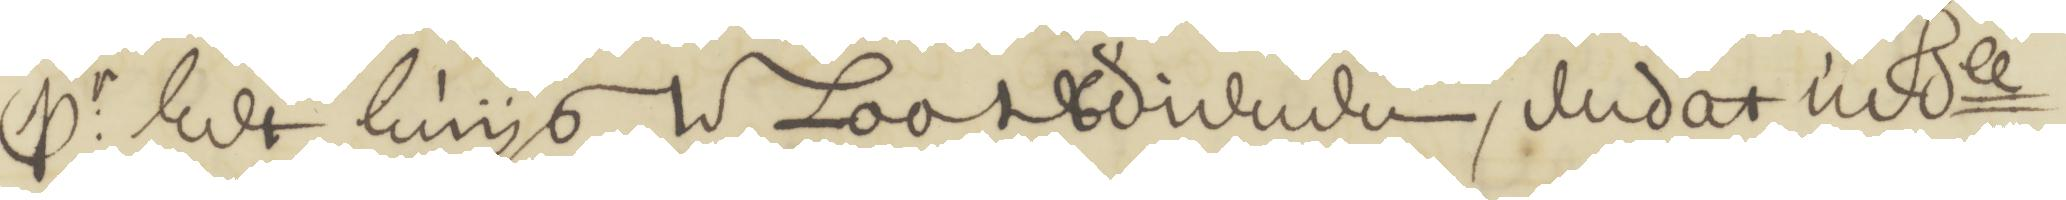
p:r het huijs te zoo teb'dienen, en dat uEd=le
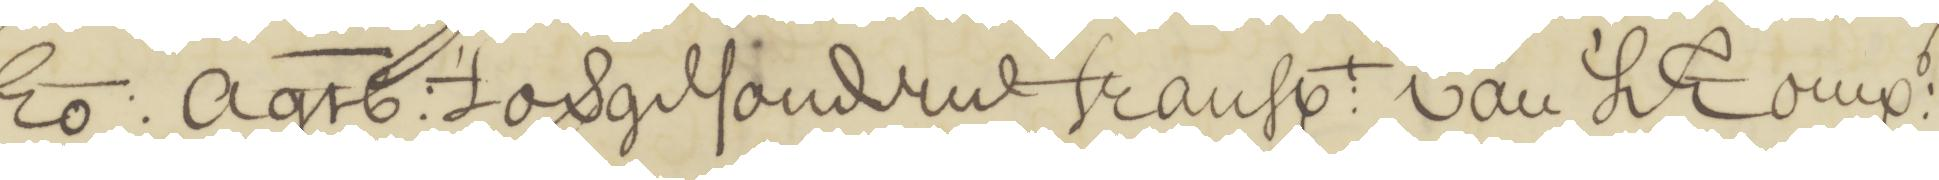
ho: Agtb: 't overgesondene transp:t van 'sEcomp:s
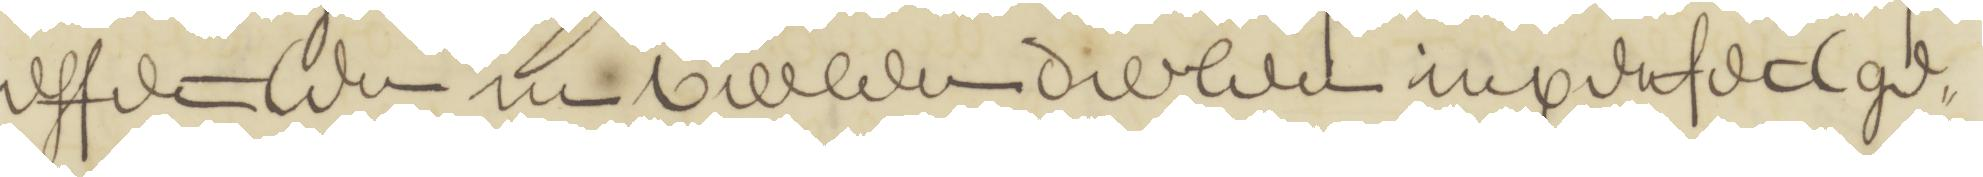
Effecten in veelen deelen inperfect ge„
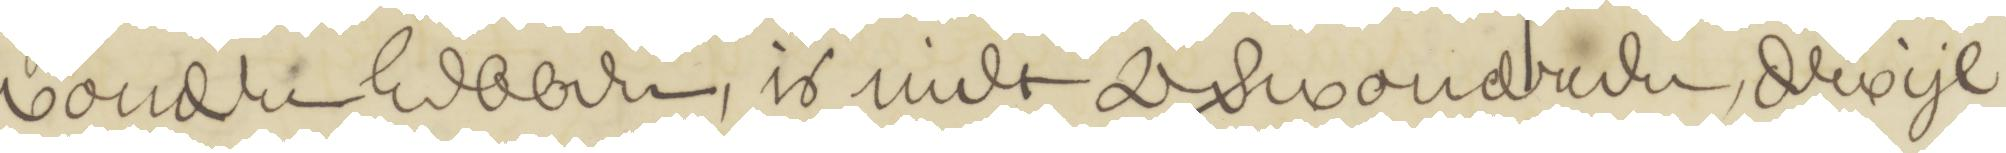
vonden hebben, is niet teverwonderen, dewijl
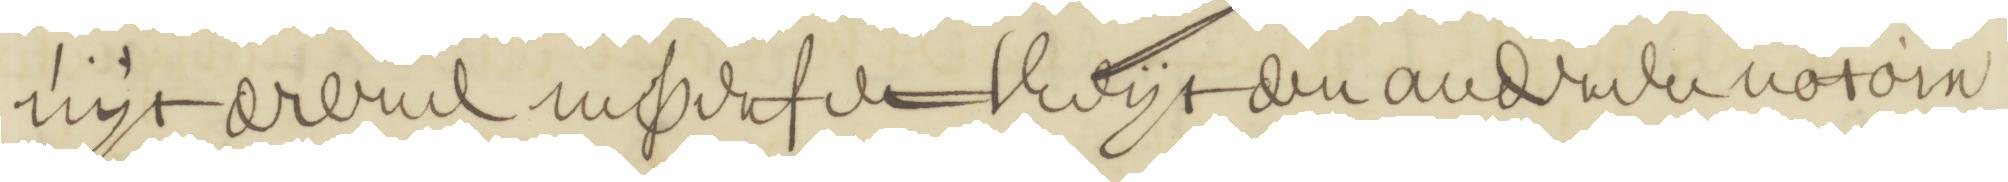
uijt deene inperfectheijt den anderen notoir
